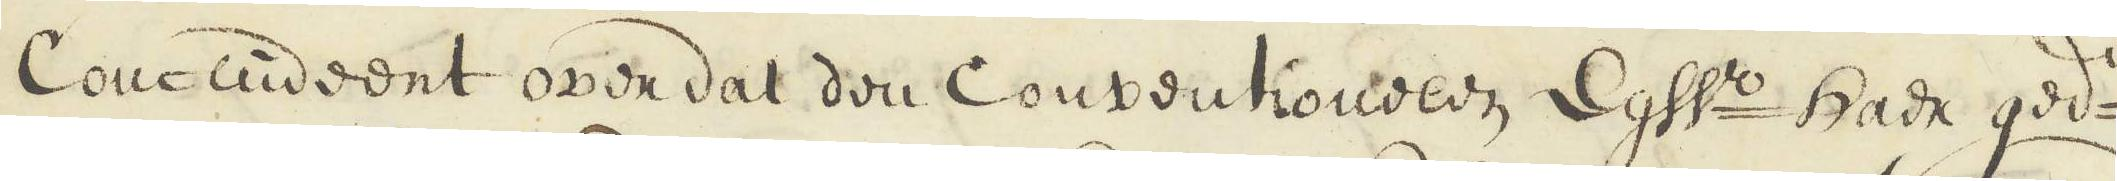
Concludeert over dat den Conventionelen Eijss=r haer ged=e
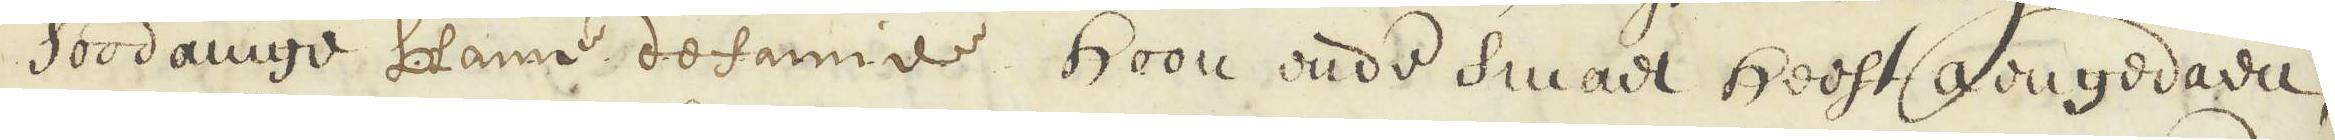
soodanige blame defamie hoon ende smaet heeft aengedaen,
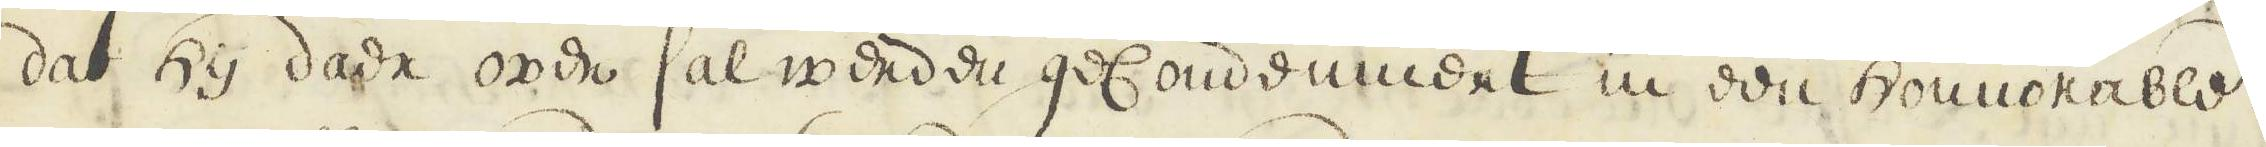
dat hij daer over sal werden gecondemnert in een honnorable
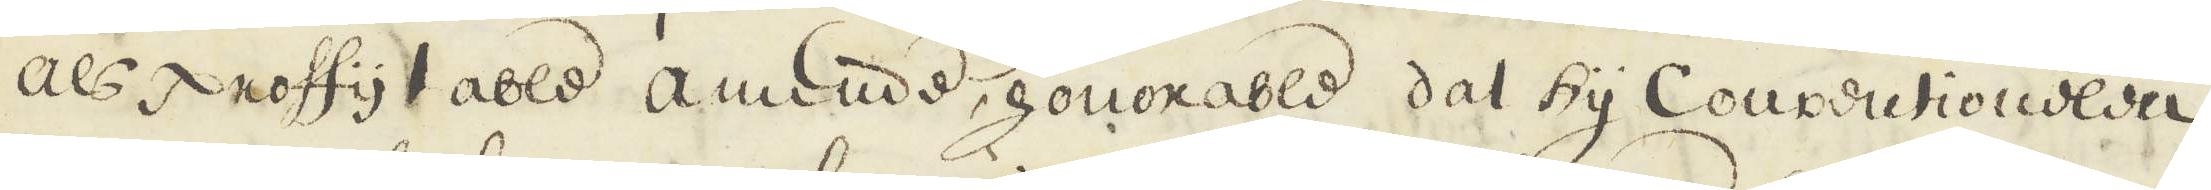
als proffijt able amende, honorable dat hij Conventionelen
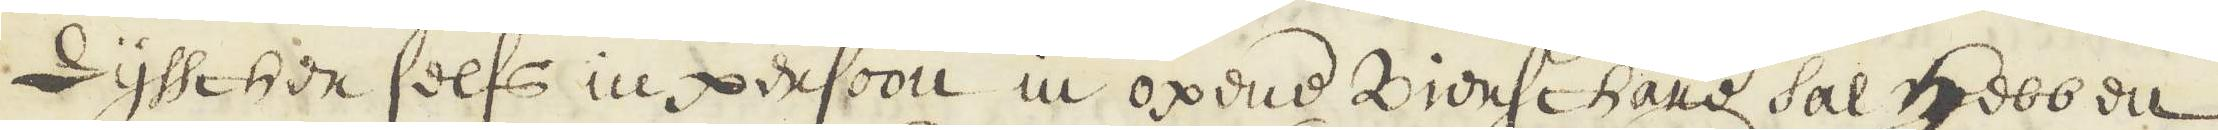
Eijsscher selfs in persoon in opene vierschare sal hebben
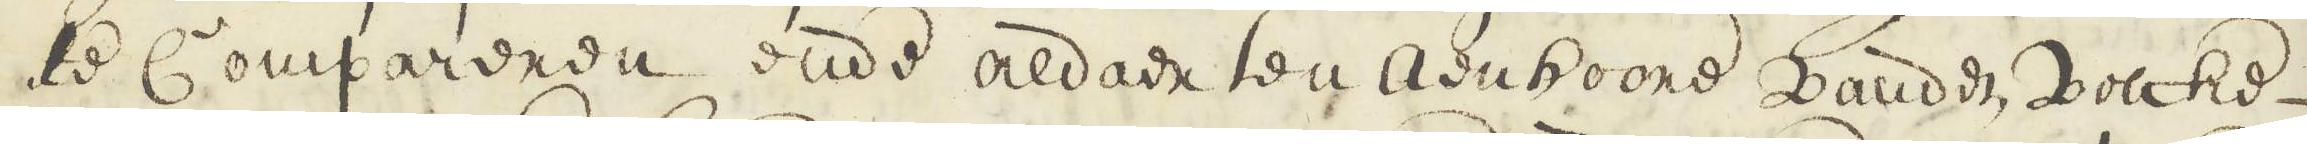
te Compareren ende aldaer ten Aenhoore vanden volcke_
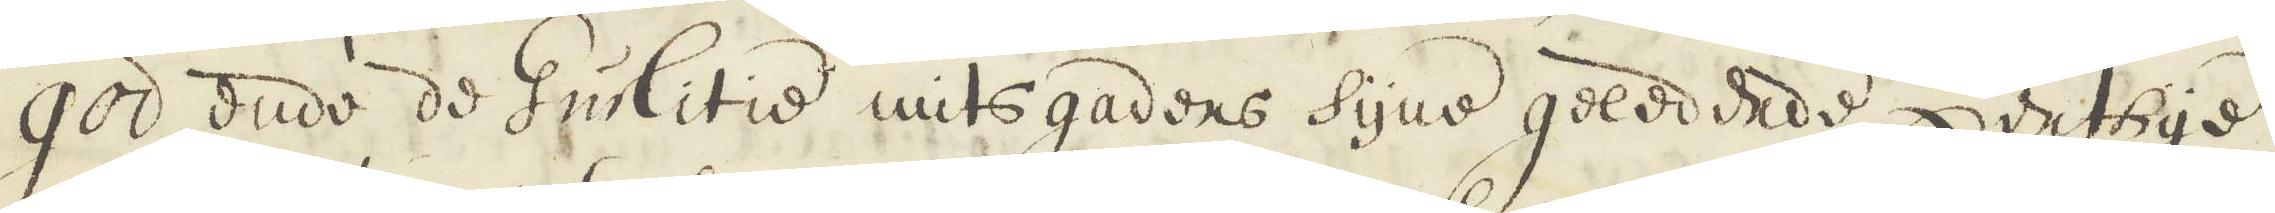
god ende de Justitie mitsgaders sijne gelederde perthije
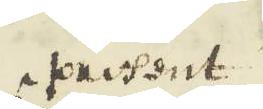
^ present:
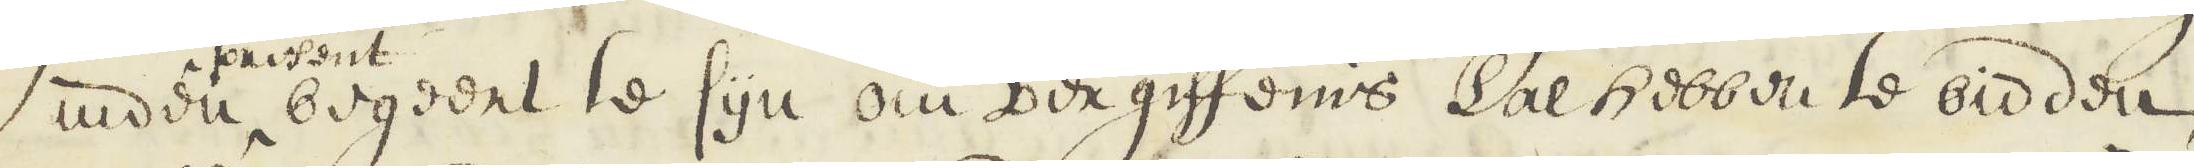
inden ^ begeert te sijn om vergiffenis sal hebben te bidden
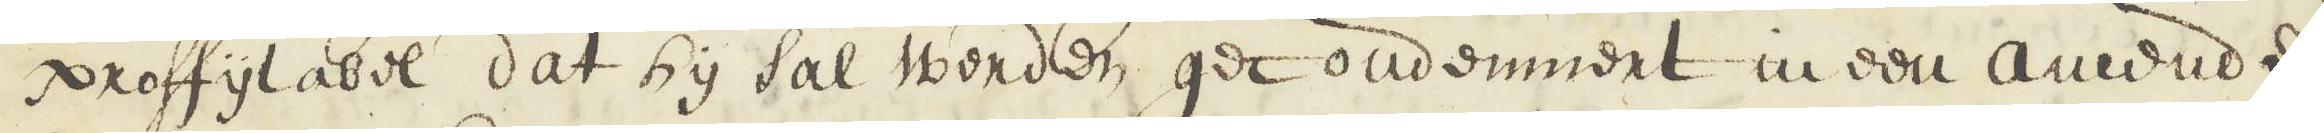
proffijtabel dat hij sal werden gecondemnert in een amende
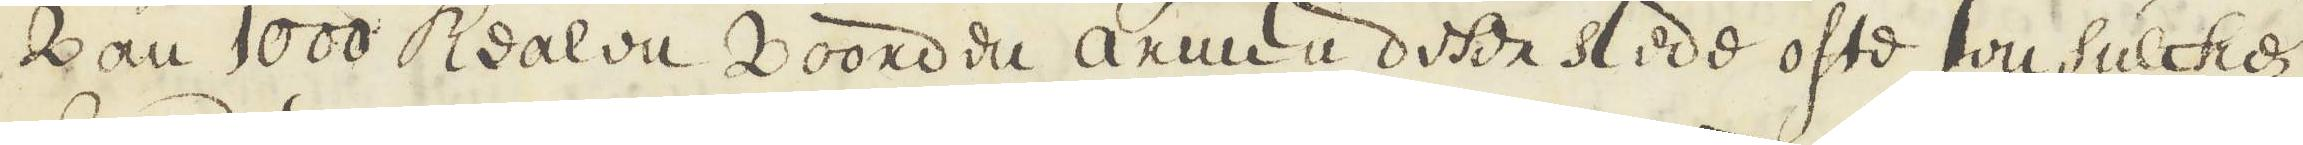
van 1000 Realen voorden armen deser stede ofte ten sulcken
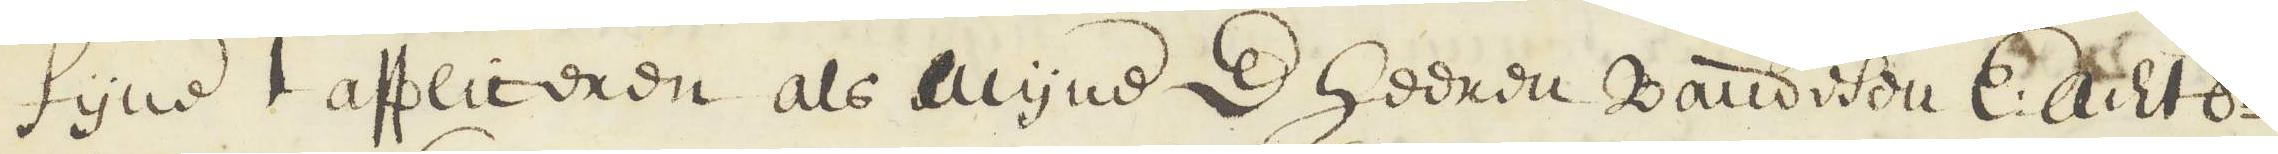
fijne t appliceren als mijne E heeren vandesen E: Achtb=n
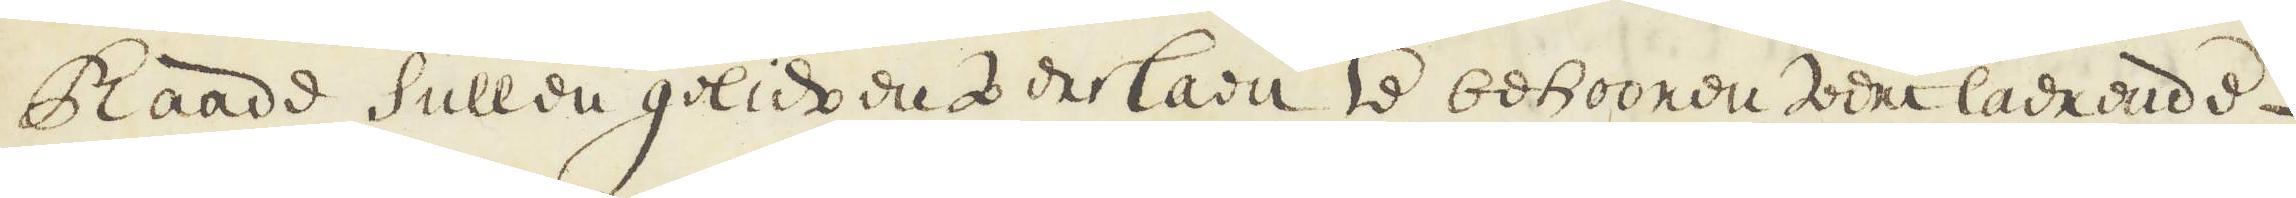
Raade sullen gelieven verstaen te behooren verclaerende -
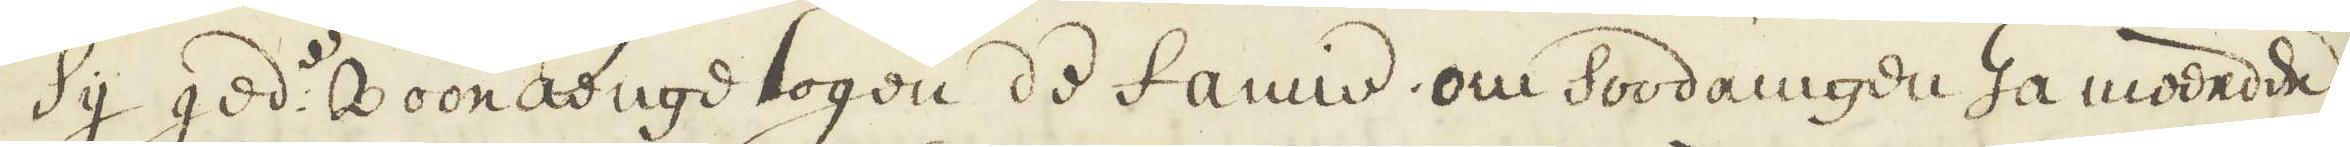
sij ged:e vooraengetogen de famie om soodanigen Ja meerder
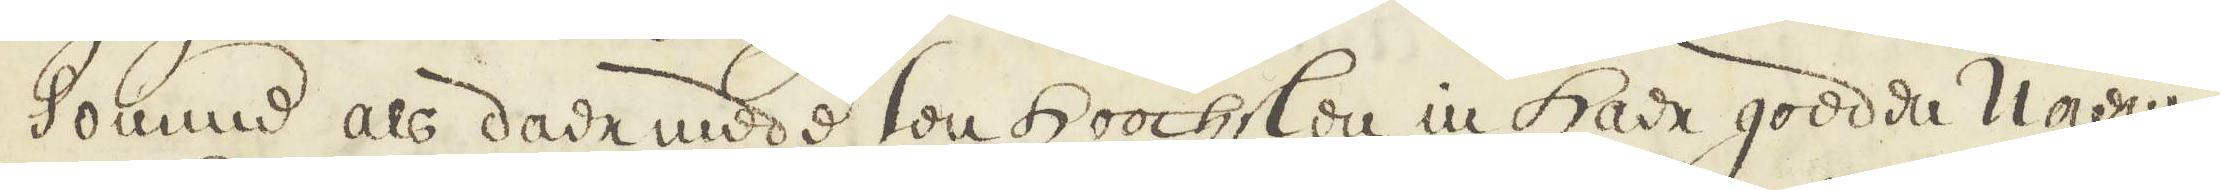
somme als daermede ten hoochsten in haer goeden Naem
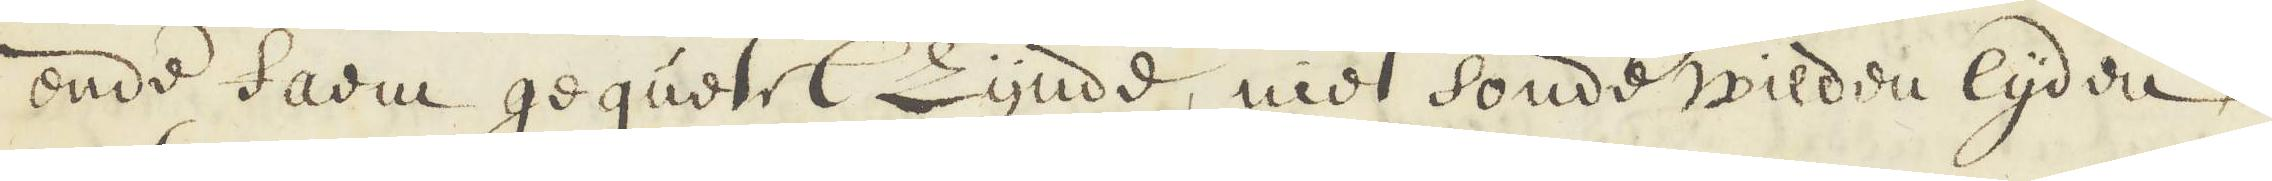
ende faem gequetst zijnde, niet soude wilden lijden,
